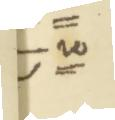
=to
